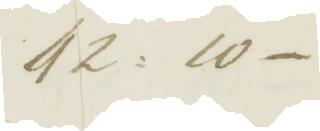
42: 10 —
